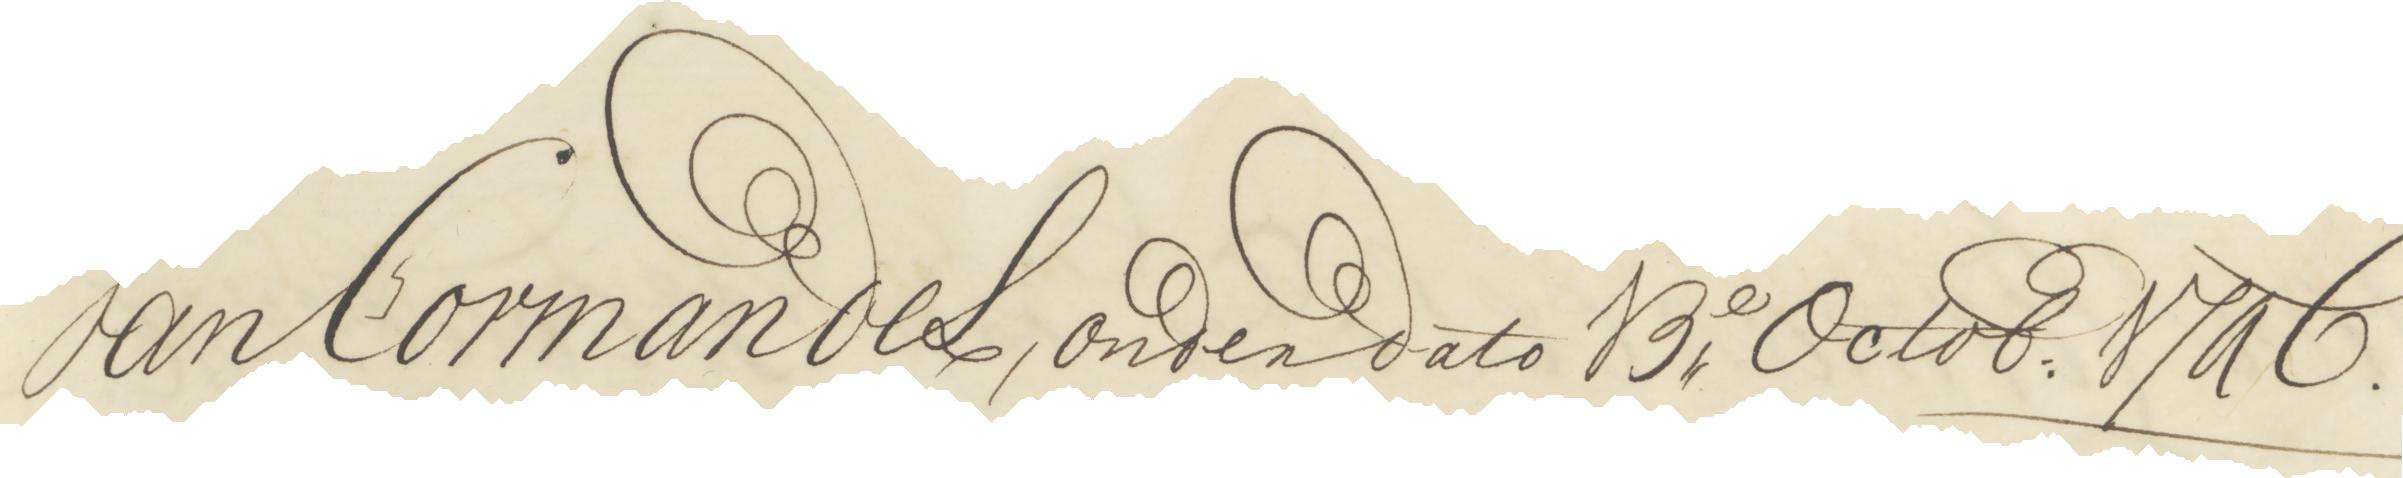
Van Cormandel, onder dato 13„e Octob: 1746.
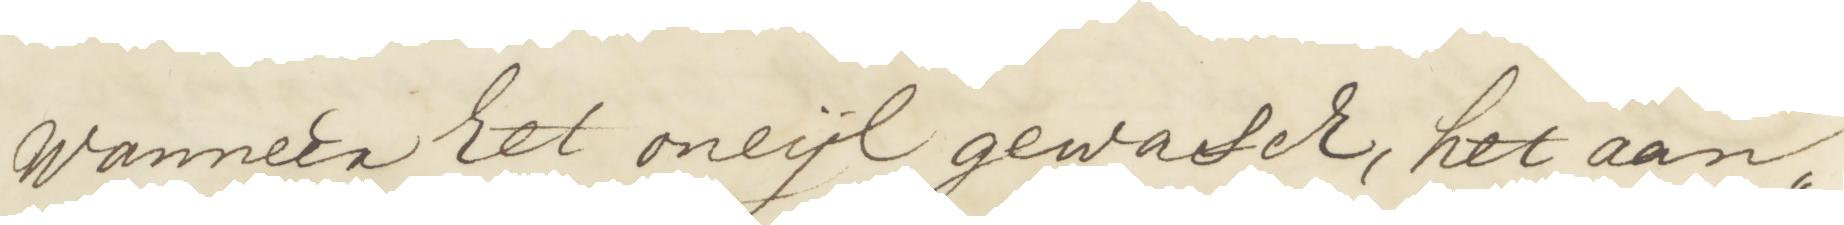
wanneer het oneijl gewasch, het aan
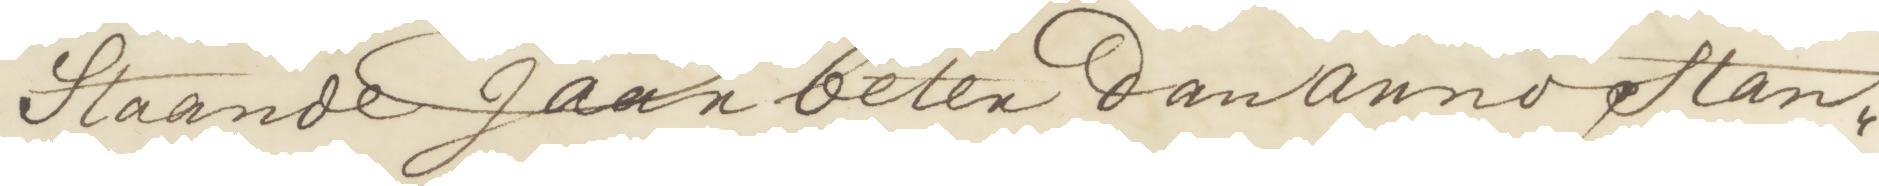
staande Jaar beter dan anno stan„
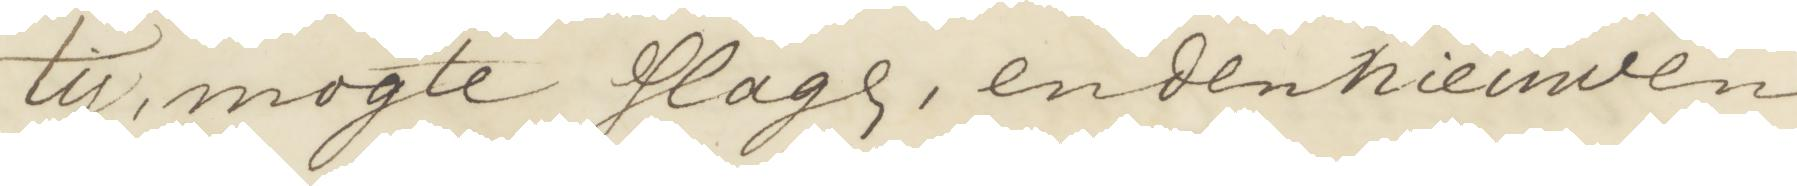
tij, mogte slagen, en den nieuwen
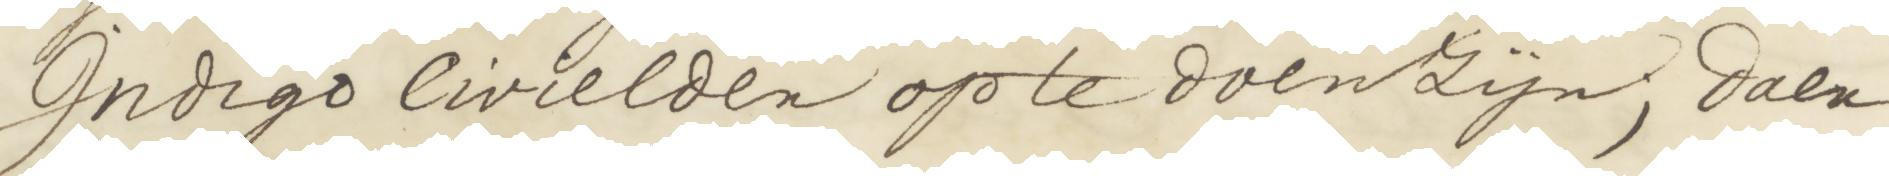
Indigo civielder op te doen zijn; daer
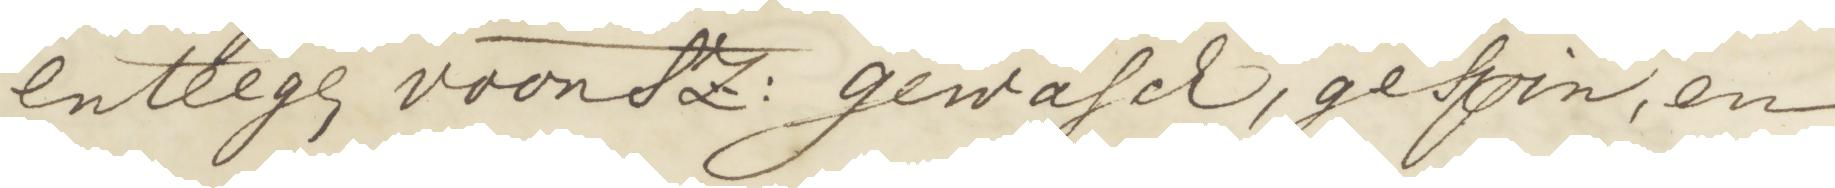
enteegen voorsz: gewasch, gespin, en
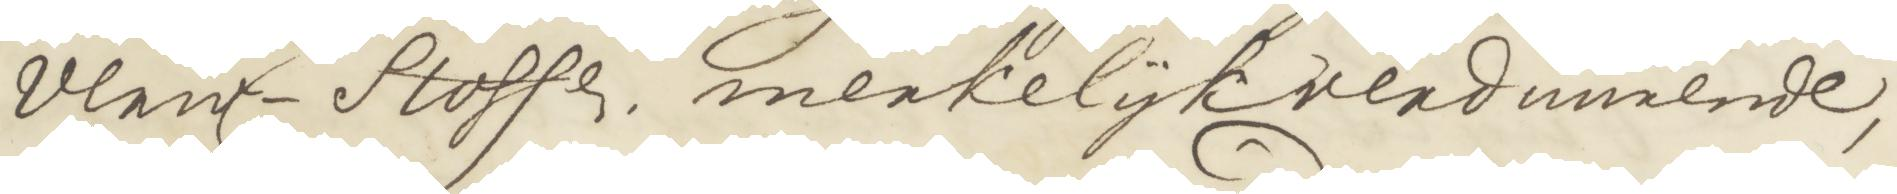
verw-stoffen, merkelijk verduurende,
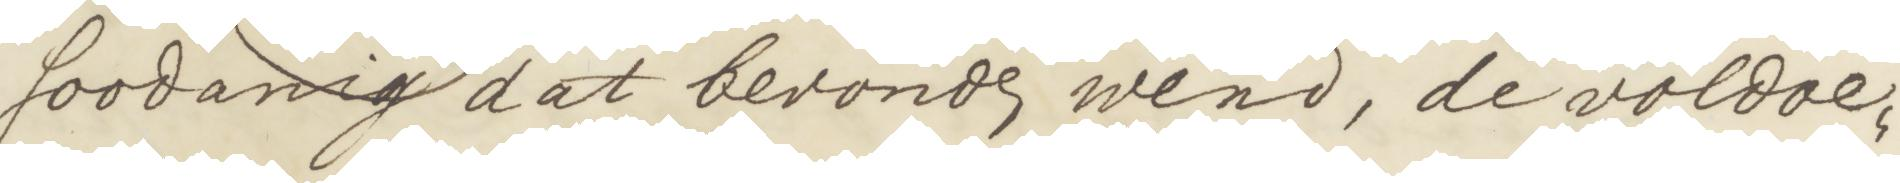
soodanig dat bevonden werd, de voldoe„
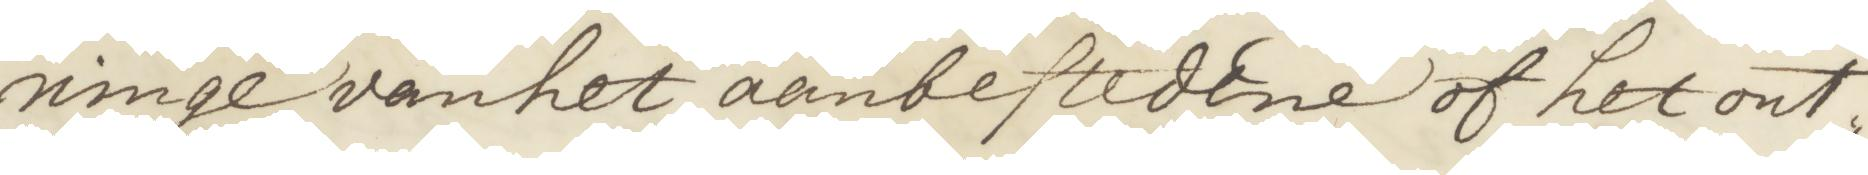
ninge van het aanbestedene of het ont„
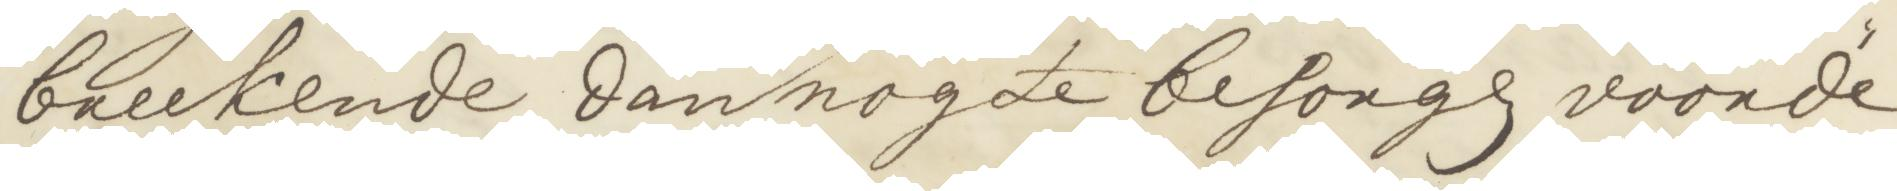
breekende dan nog te besorgen voor de
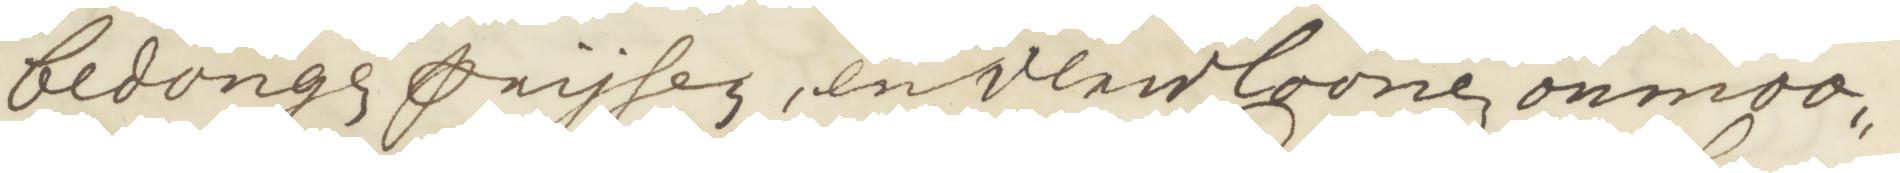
bedongen prijsen, en verwloonen onmoo„
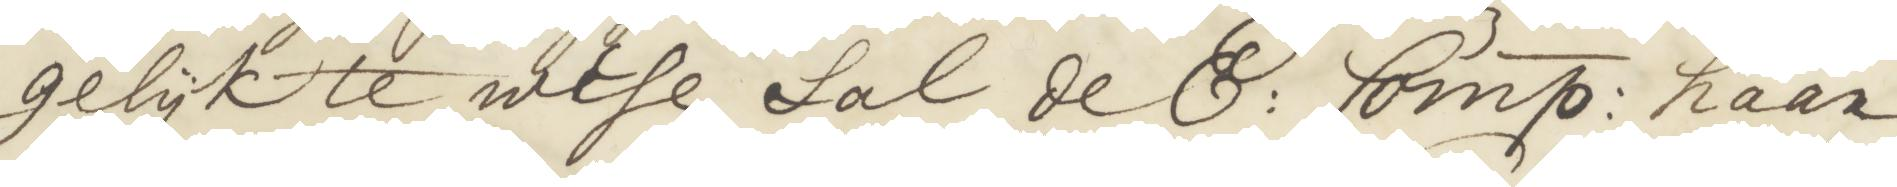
gelijk te wesen sal de E: Comp: haar
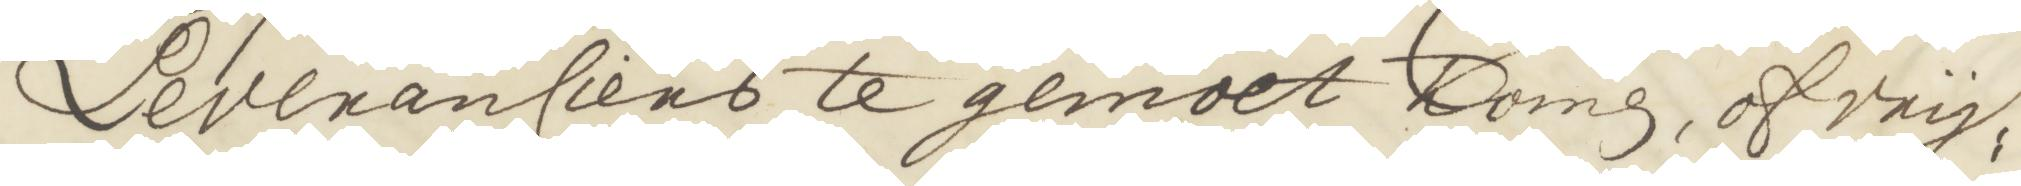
Leveranciers te gemoet komen, of vrij„
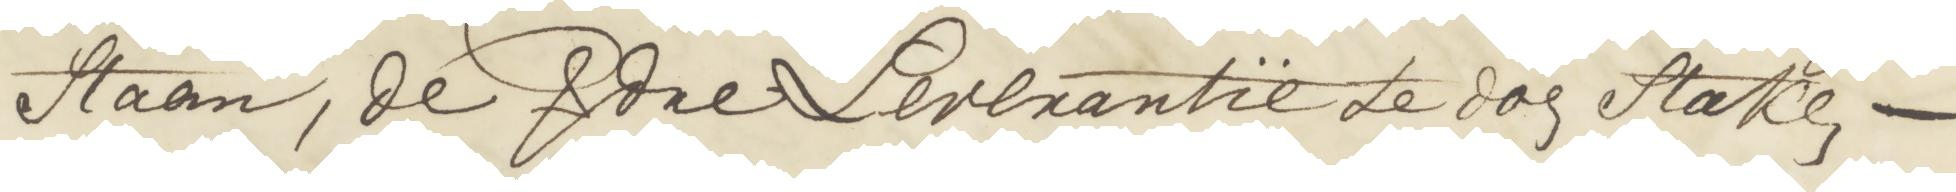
staan, de verdre Leverantie te doen staken —
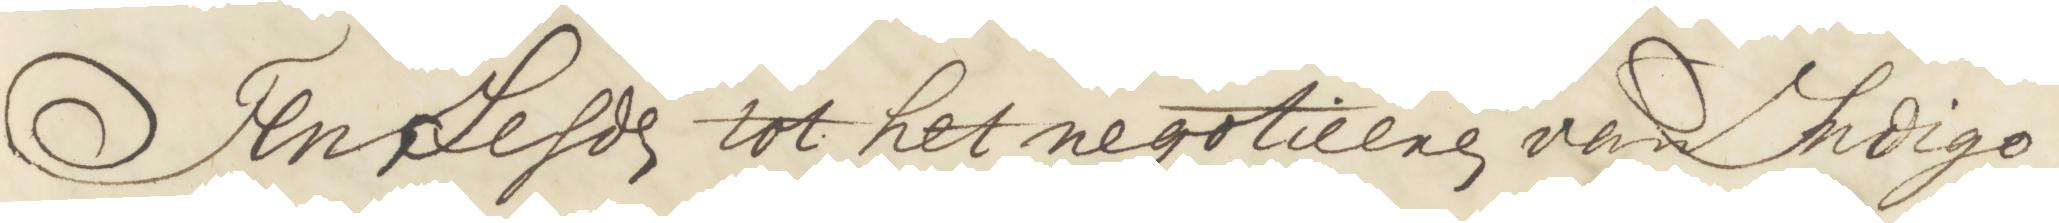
Ten Sesden tot het negotieeren van Indigo
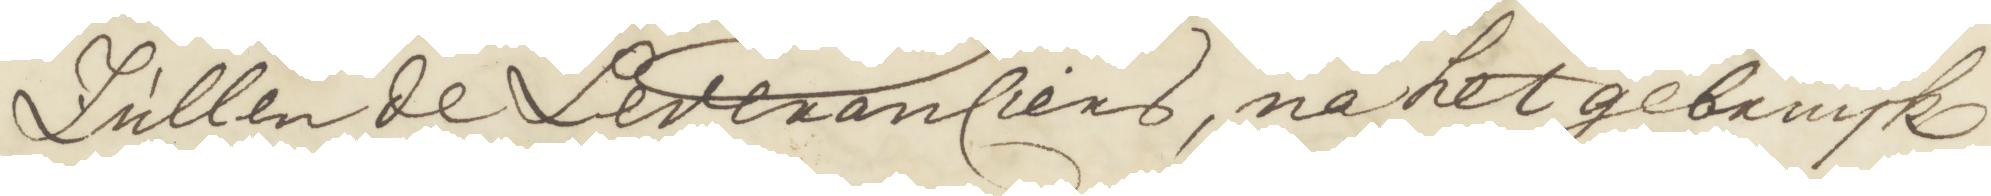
zullen de Leveranciers, na het gebruijk
